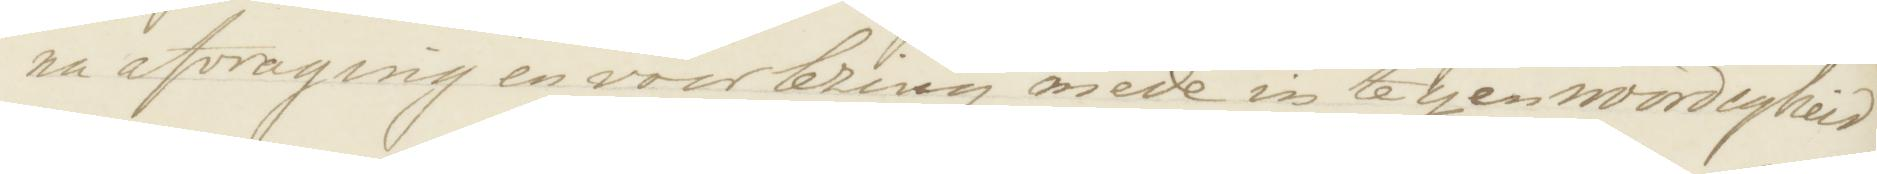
na afvraging en voorlezing mede in tegenwoordigheid
